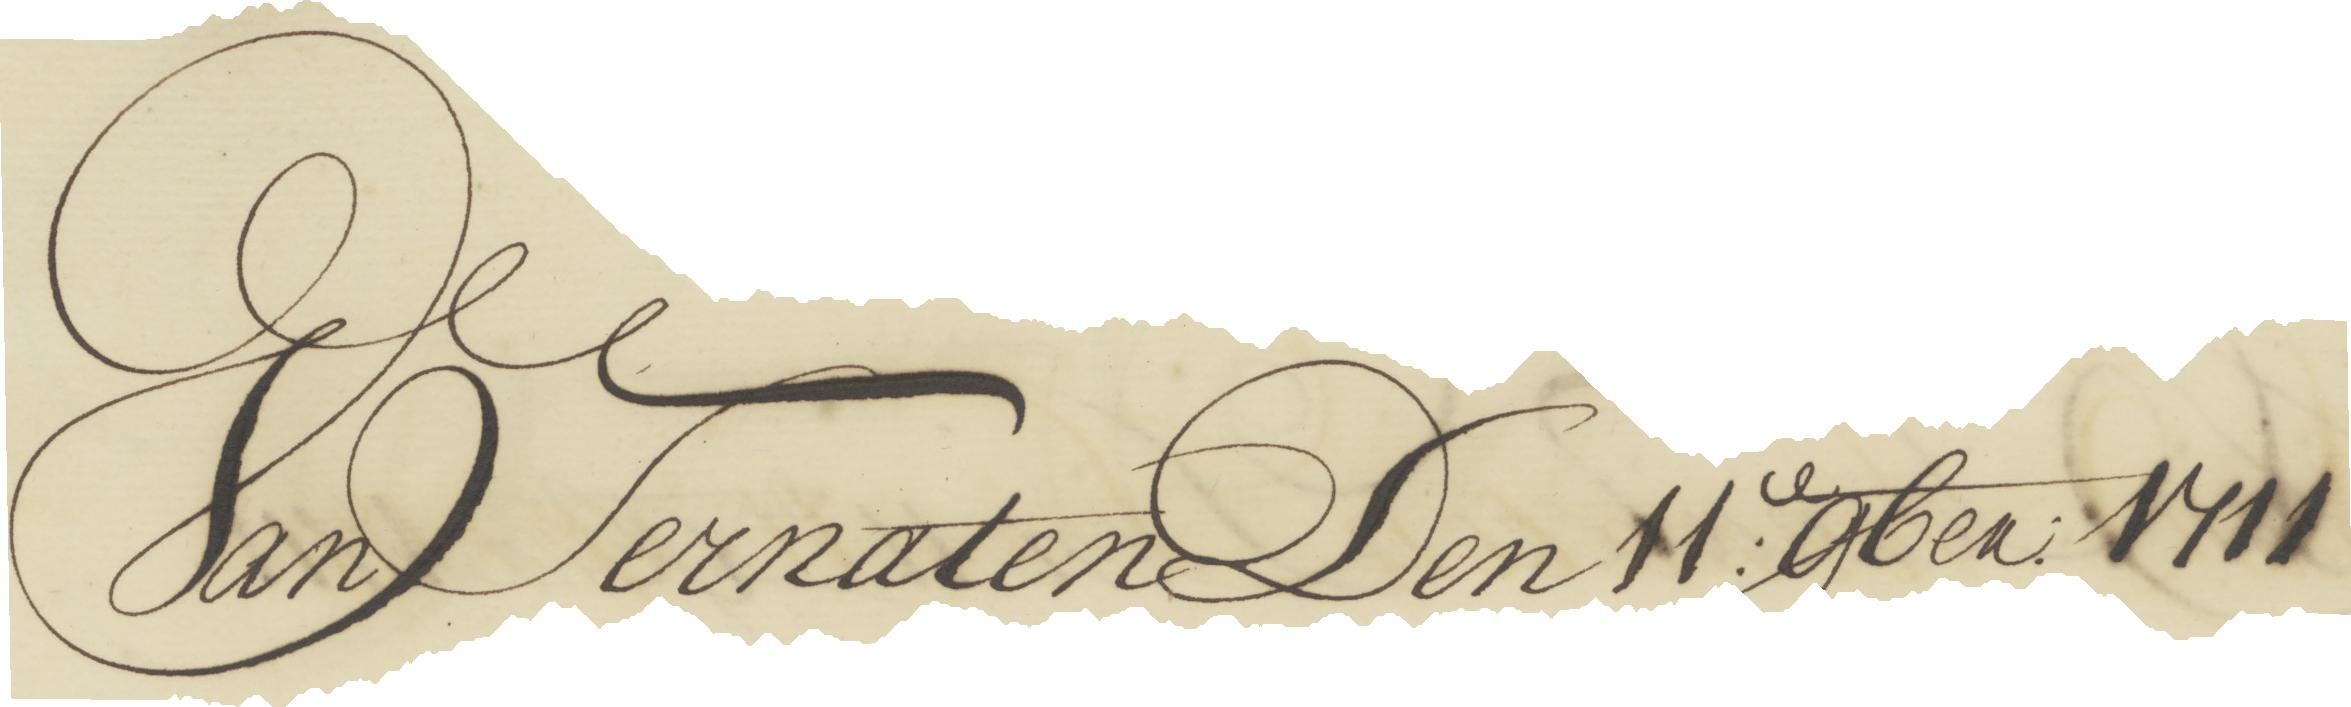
Van Ternaten Den 11:e gber: 1711
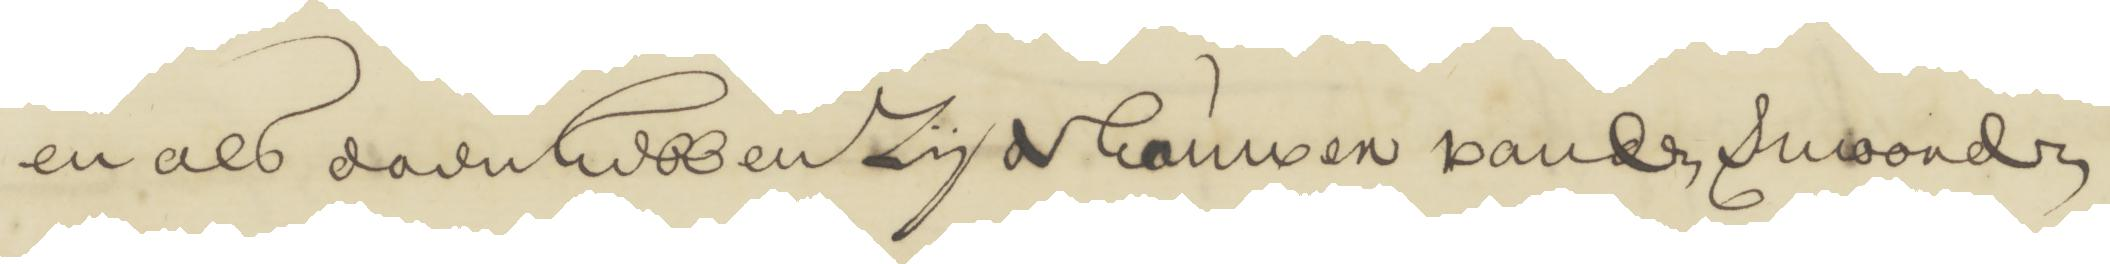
en als doen hebben Zij de houwer van den vermoorden
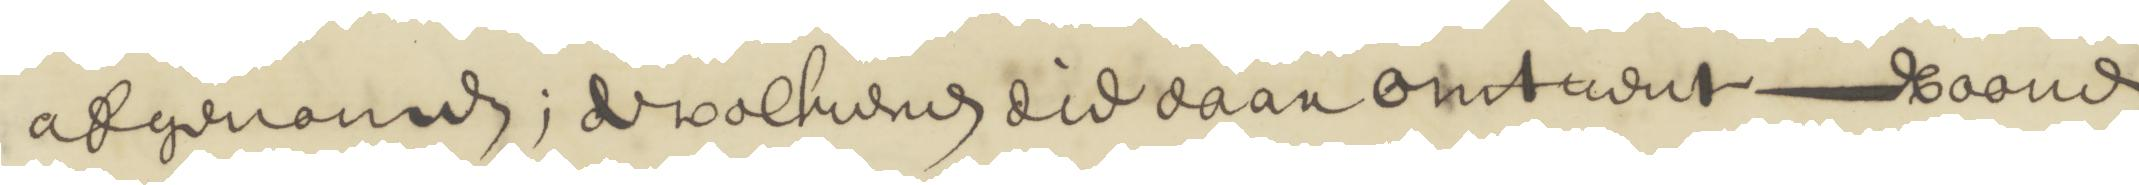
afgenomen; de volkeren die daar omtrent woonen
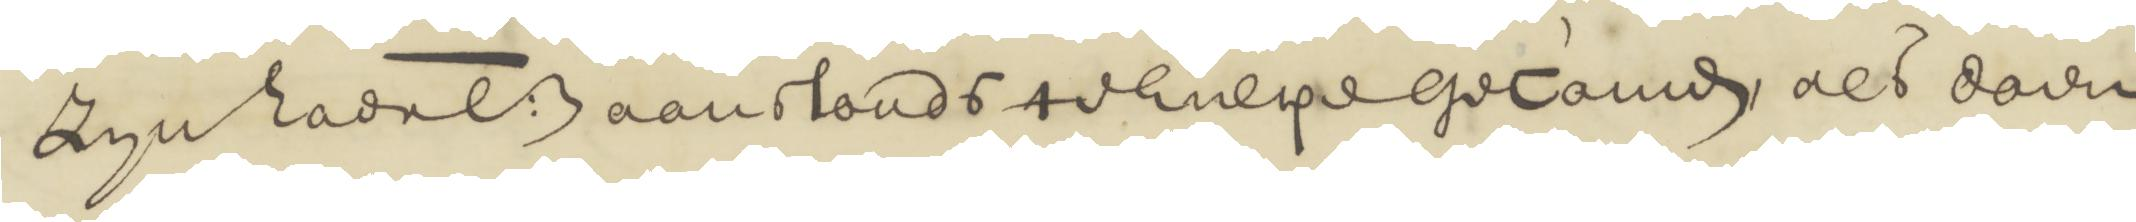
zyn haerl: aanstonds te hulpe gecomen, als doen
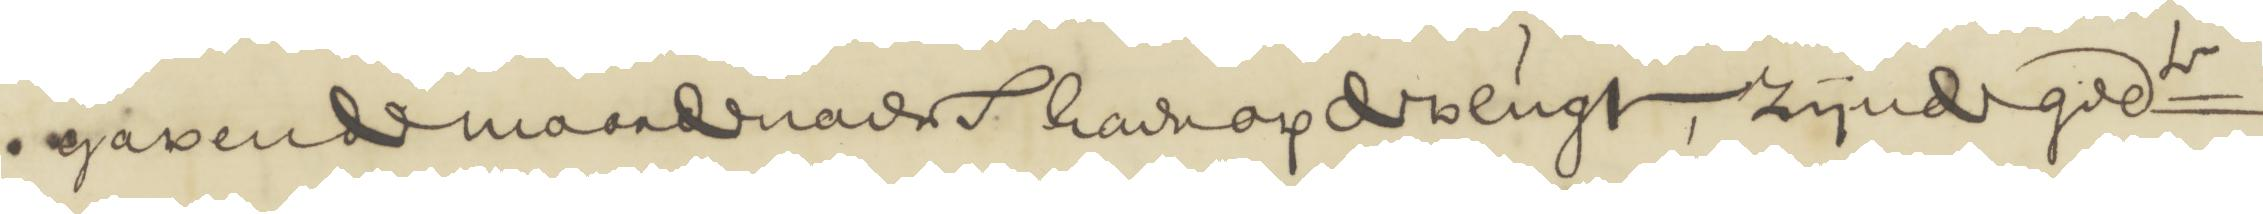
gaven de moordenaers haer op de vlugt, zijnde ged=te
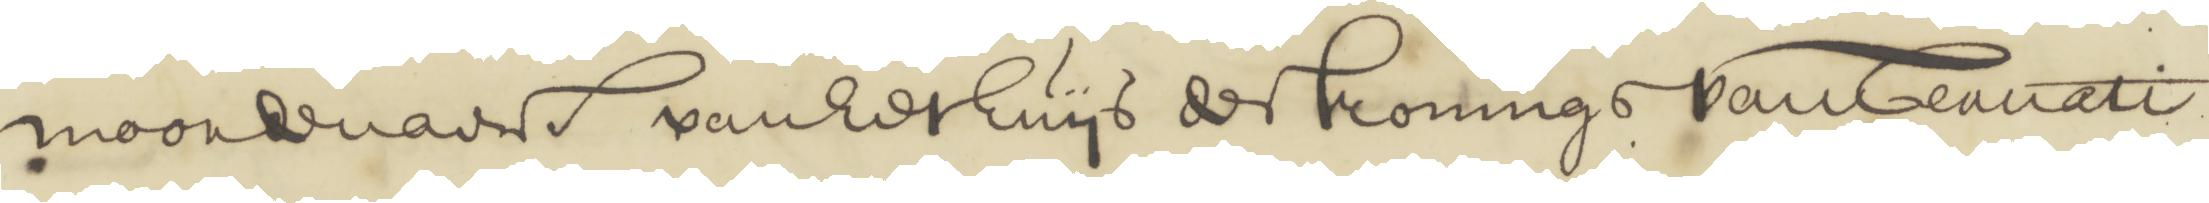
moordenaers van het huijs der konings van Ternati
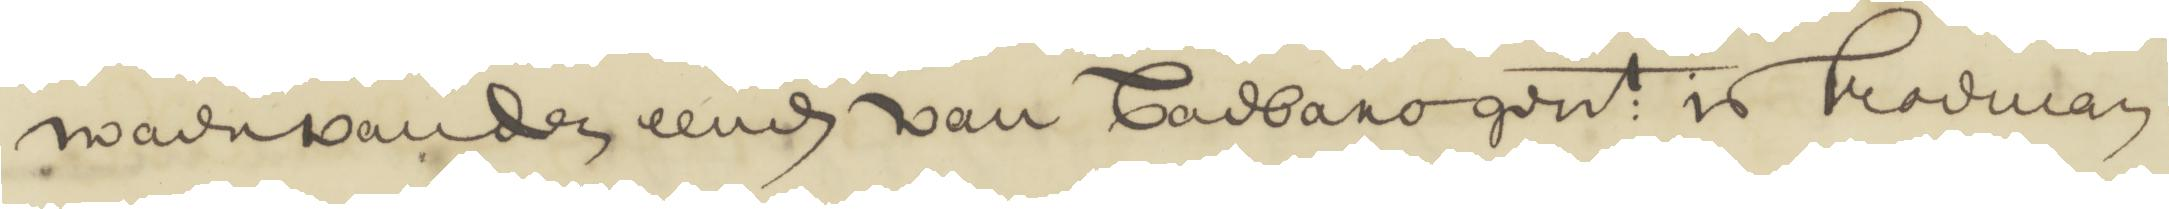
waer van den eenen van Tawaro gen:t is koeman
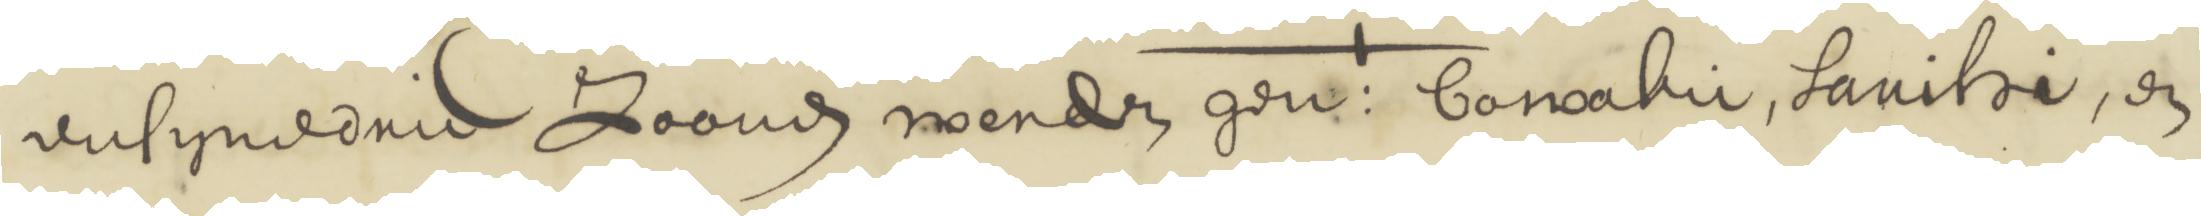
en syne drie Zoonen werden gen:t bowaki, Sarihi, en
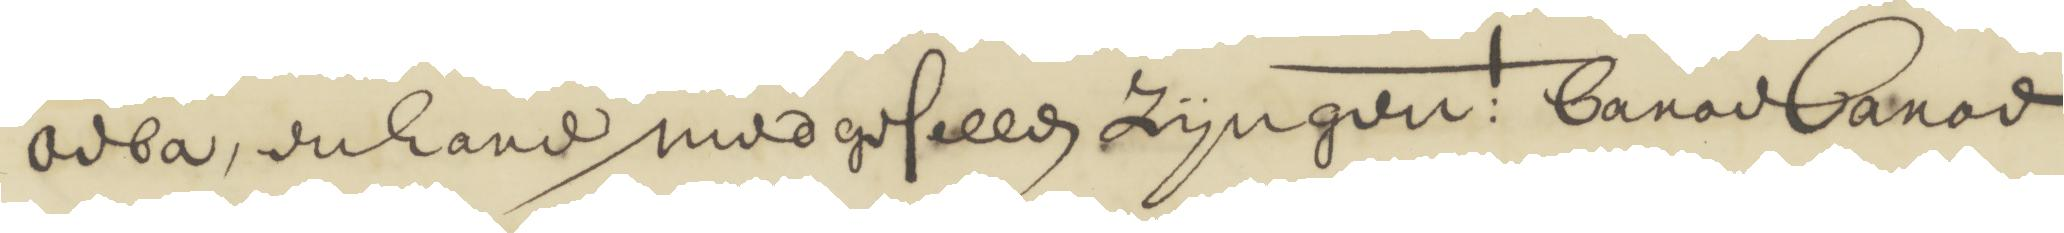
oeba, en hare med gesellen Zijn gen:t baroe baroe
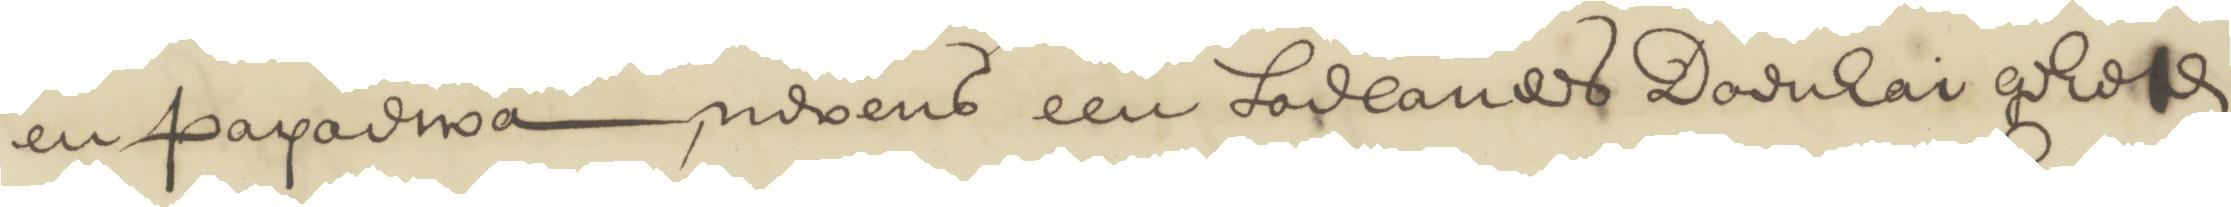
en papaewa, nevens een Soelanees Doenhai geheten,
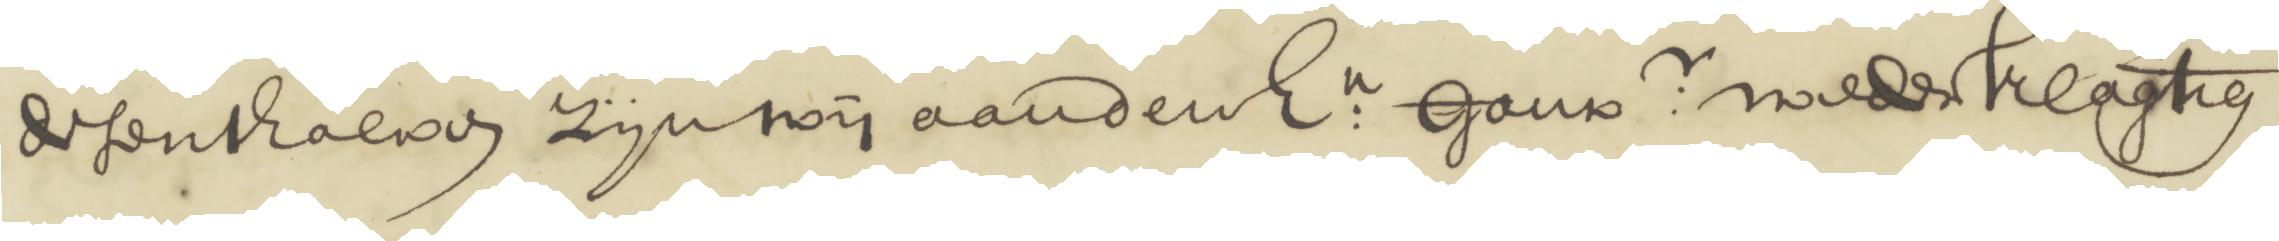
desenthalven zijn wij aan den h:r gouv:r weder klagtig
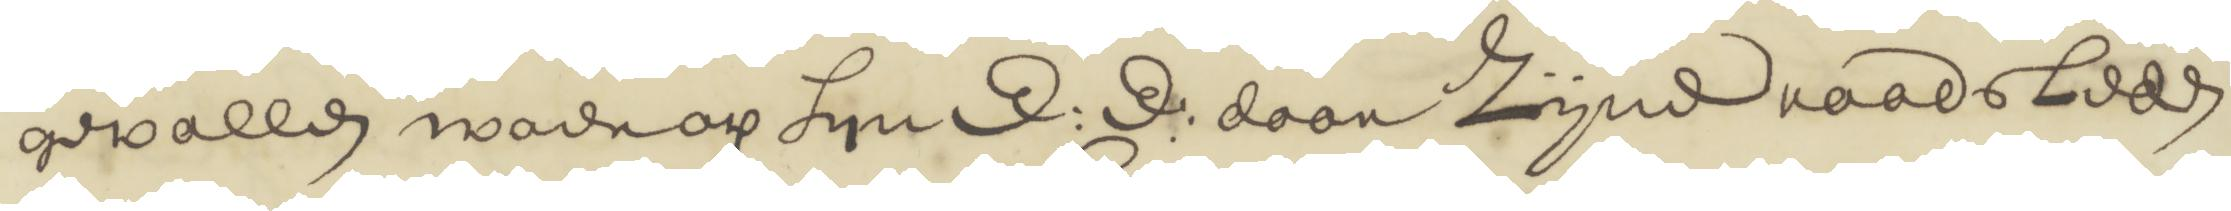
gevallen waer op Syn E: E: door Zijne raadsleden
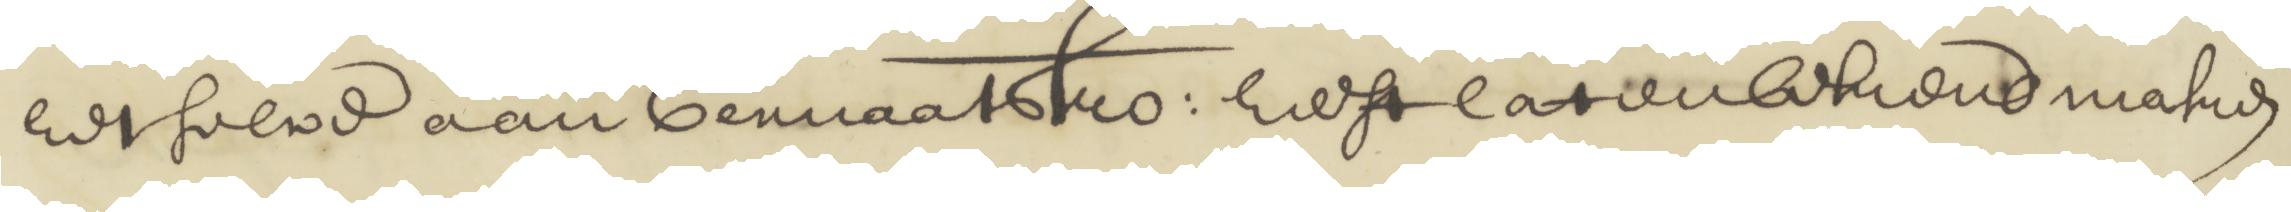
het selve aan Ternaatsko: heeft laten bekend maken
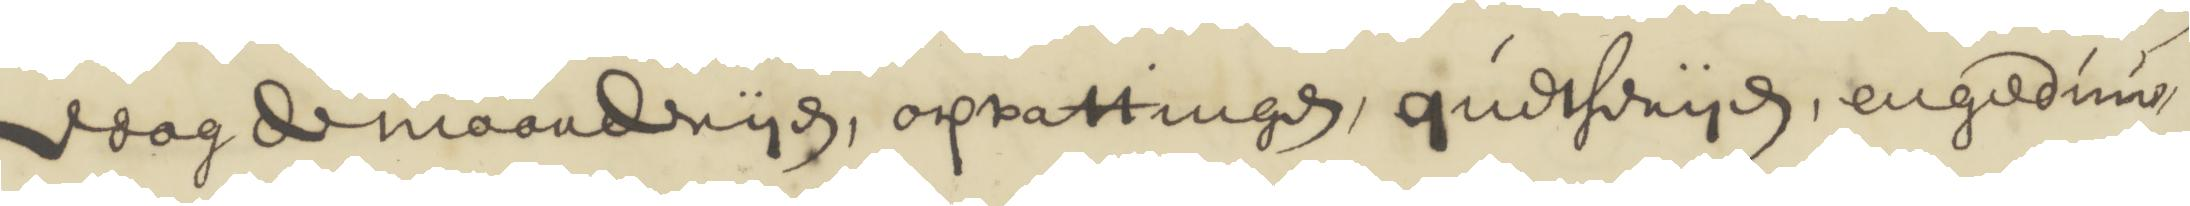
Edog de moorderijen, opvattingen, quetserijen, en geduu„
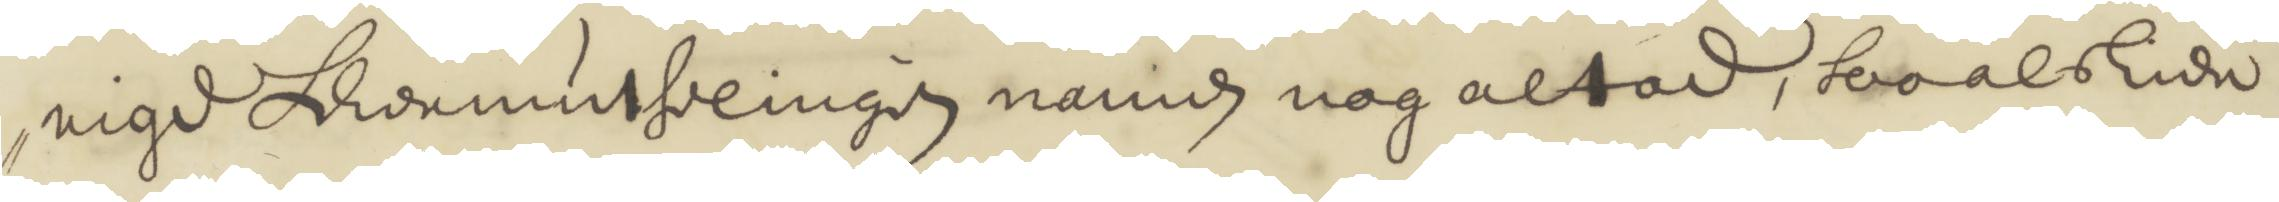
„rige Schermutselingen namen nog altoe, soo als hier
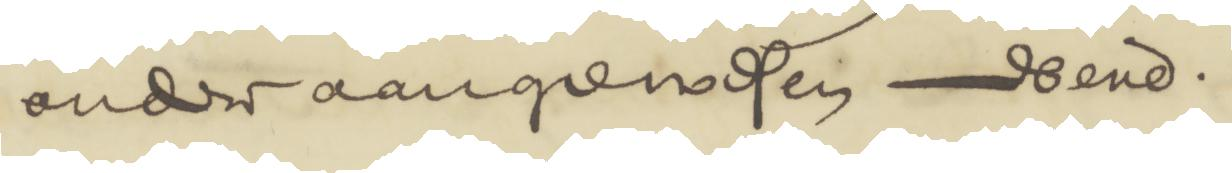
onder aangewesen werd.
